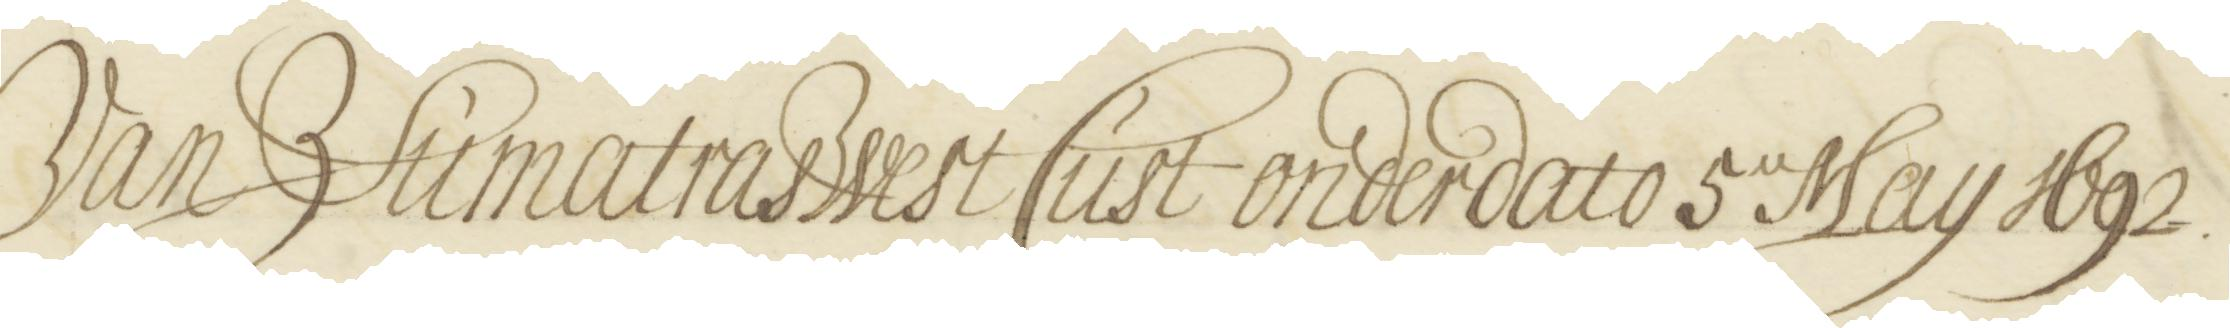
Van Sumatras West Cust onder dato 5n May 1692
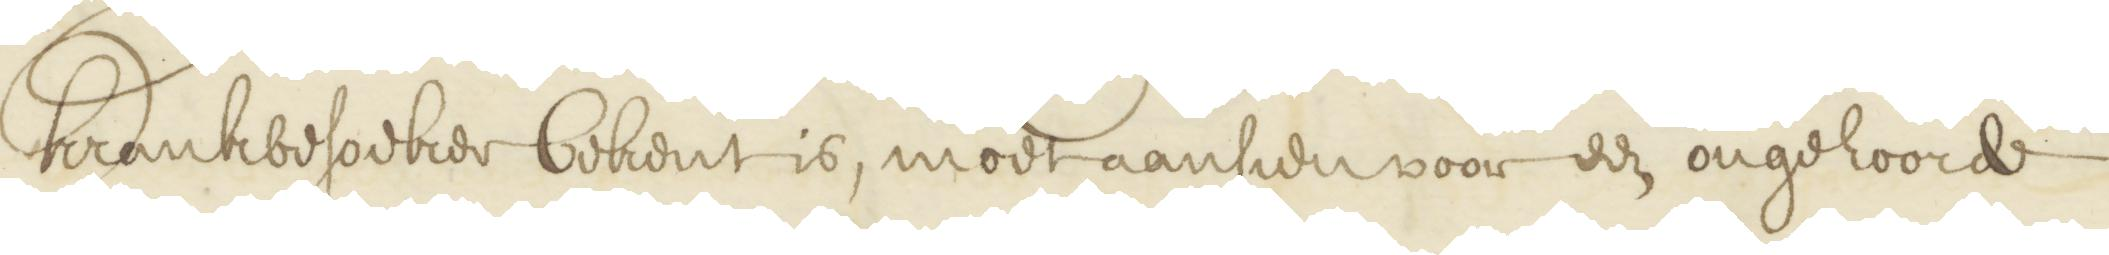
krankbesoeker bekent is, moet aansien voor een ongehoorde
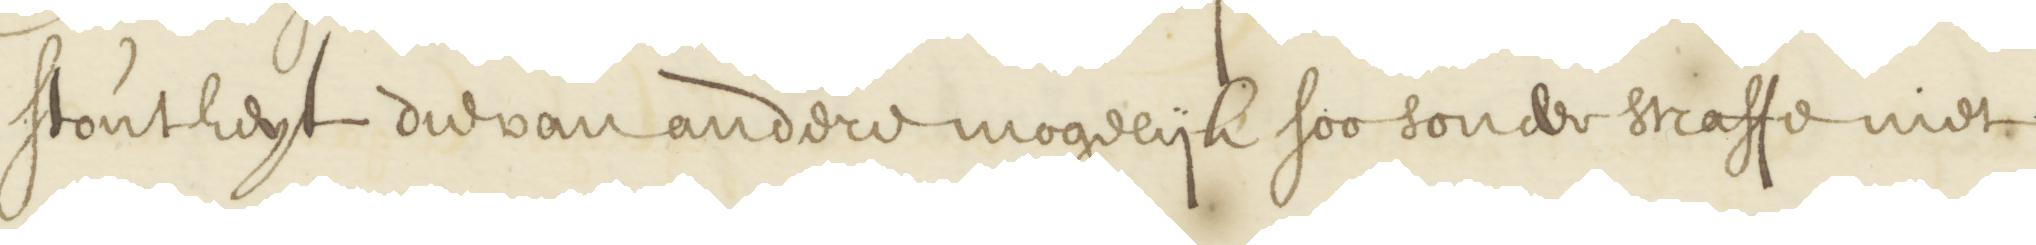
stoutheyt die van andere mogelijk soo sonder straffe niet
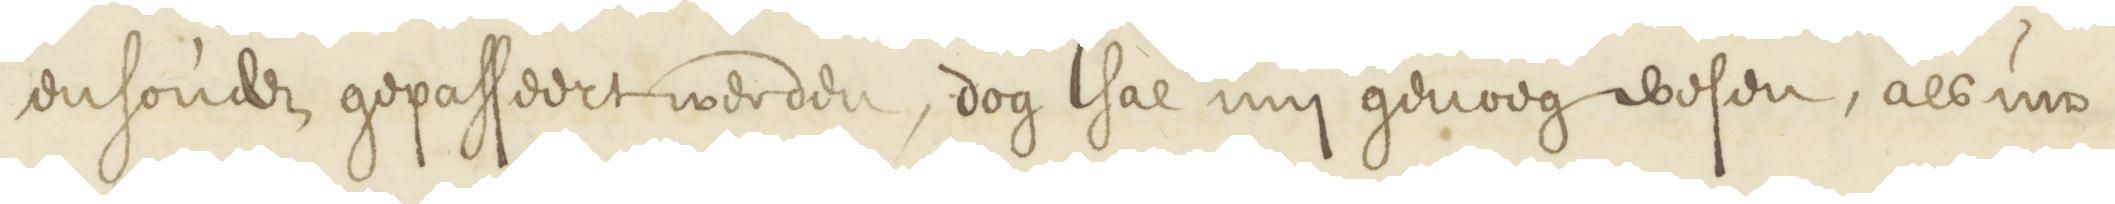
en souden gepasseert werden, dog tsal mij genoeg wesen, als uw
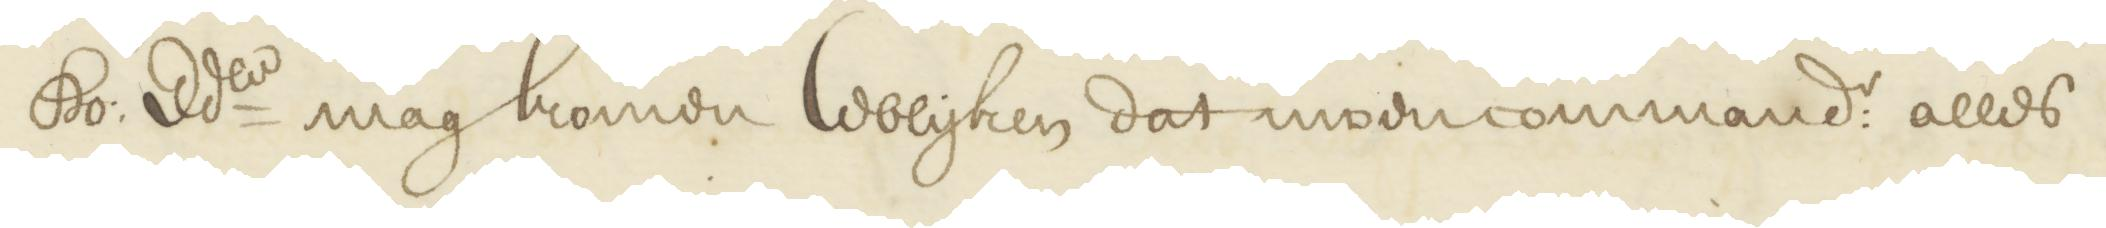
Ho: Ed=le mag komen teblijken dat uwen command:r alles
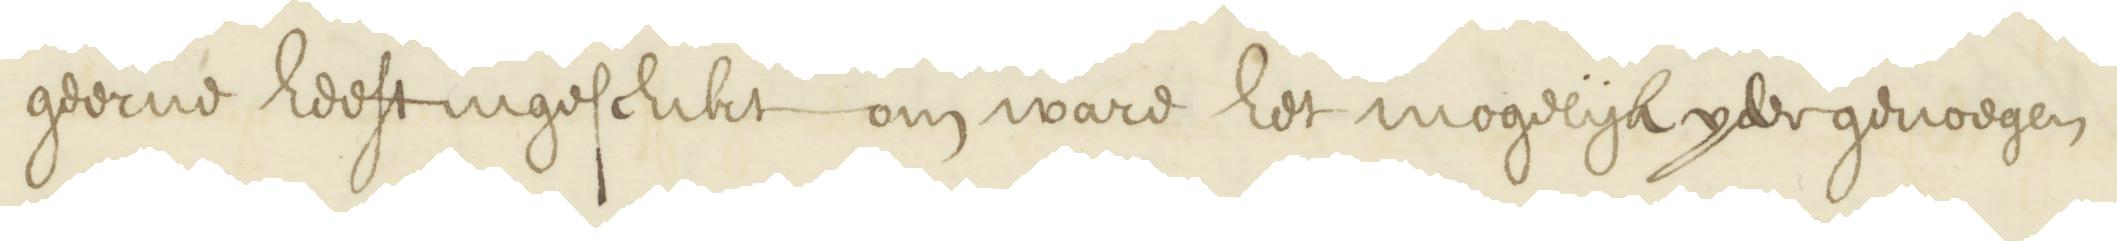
geerne heeft ingeschikt om ware het mogelijk yder genoegen
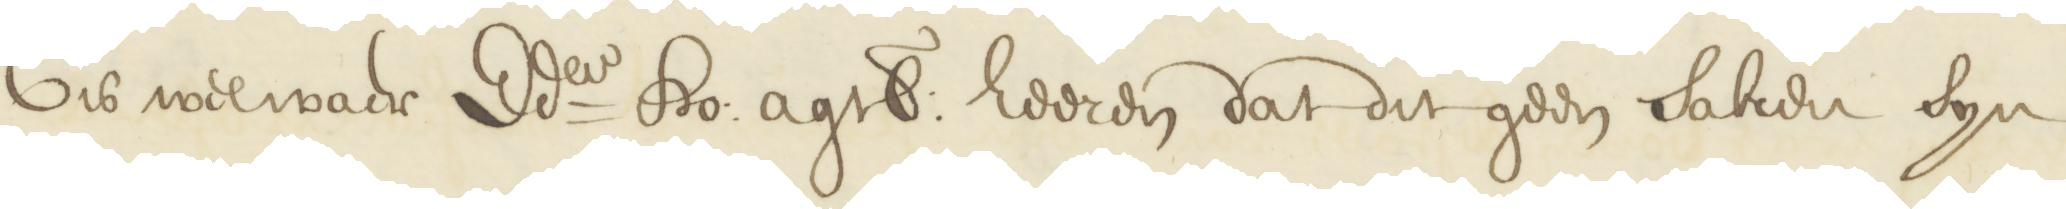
Tis welwaer Ed=le Ho: agtb: heeren dat dit geen saken syn
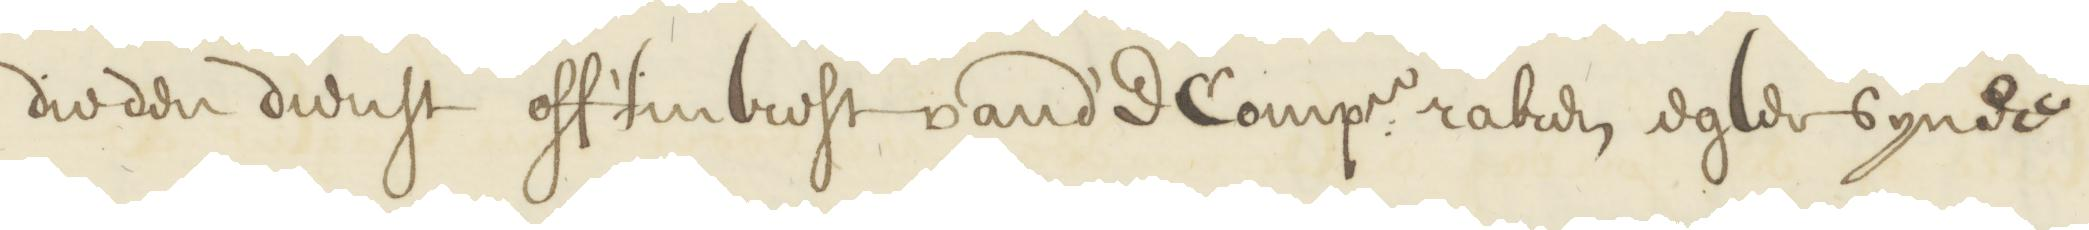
die den dienst off 'tintrest vand’E Comp:e raken egter synde
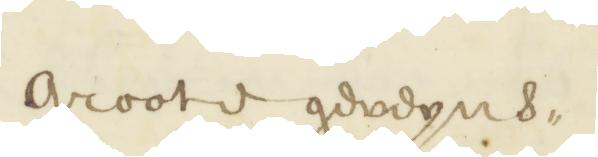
groote geveyns„
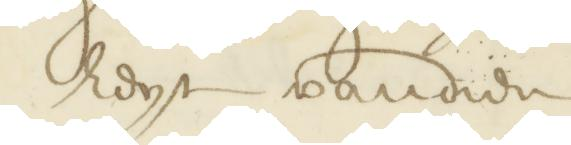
heyt vandien
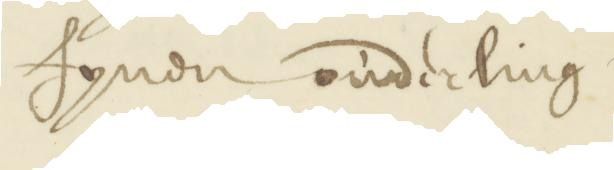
fynen ouderling
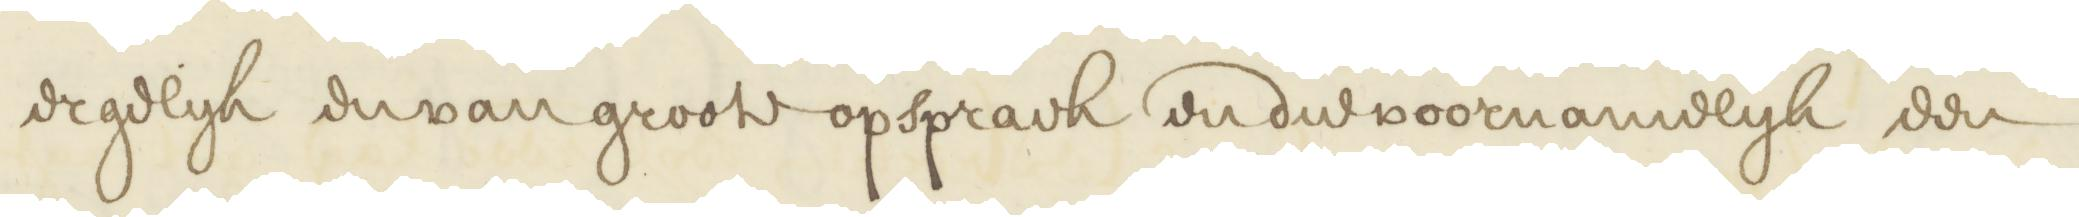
ergelijk en van groote opspraek en die voornamelijk een
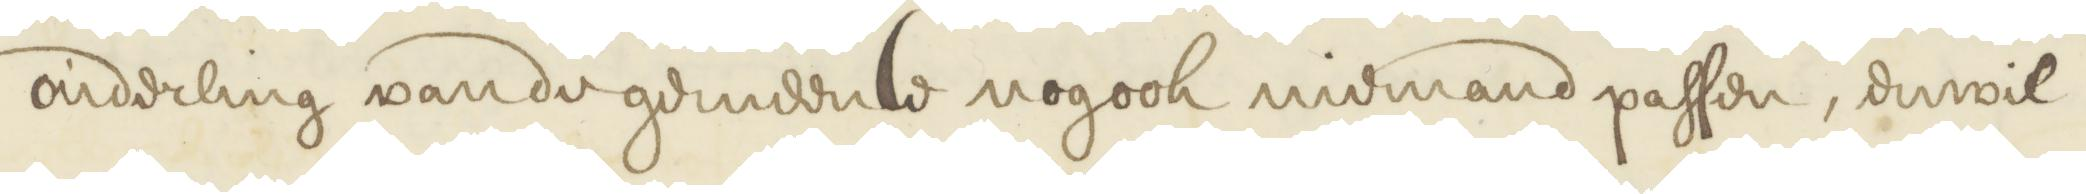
ouderling van de gemeente nog ook niemand passen, en wil
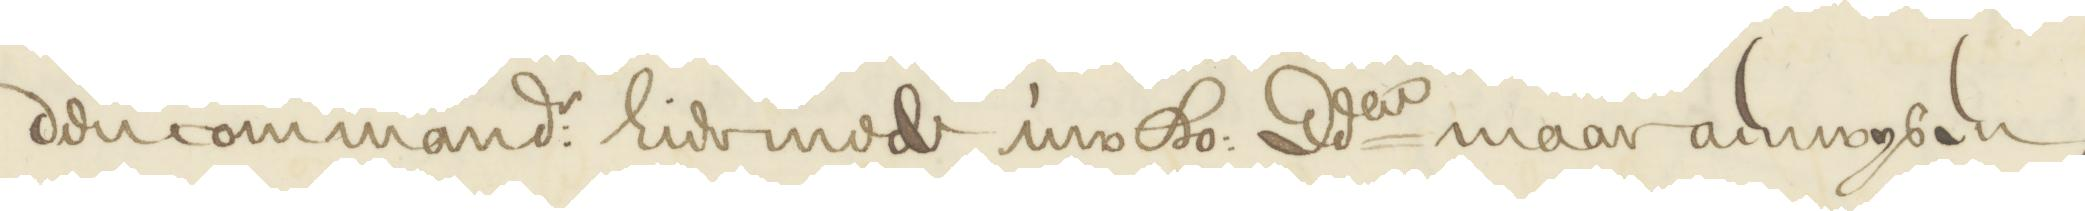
den command:r hiermede uw Ho: Ed=le maar aenwysen,
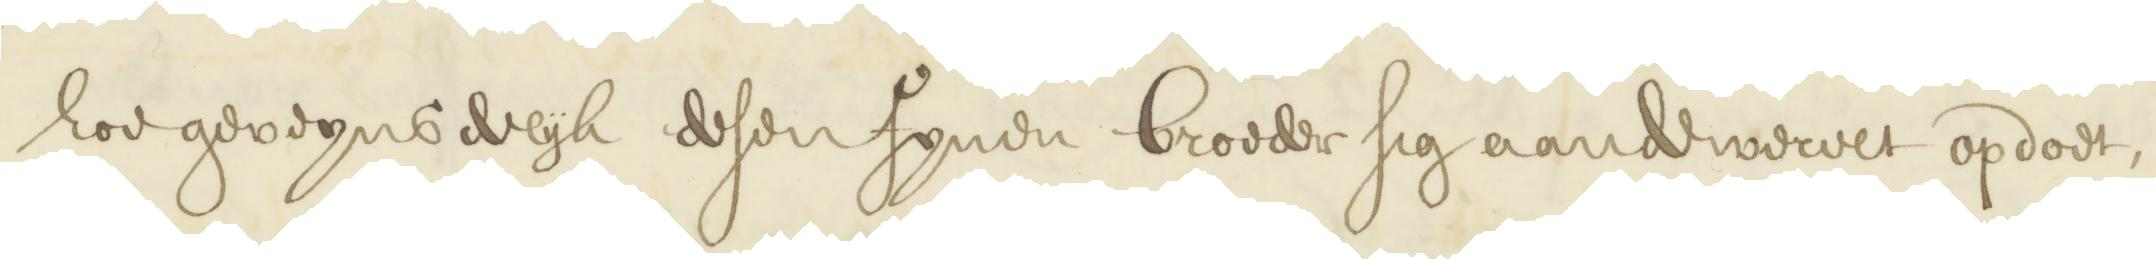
hoe geveynsdelijk desen Fijnen broeder sig aan de werelt op doet,
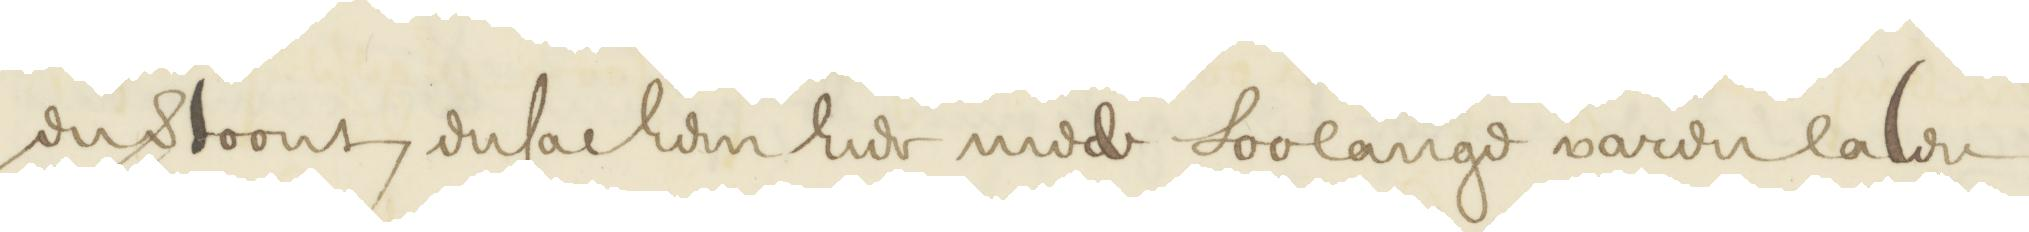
en vertoont, en sal hem hier mede soo lange varen laten
